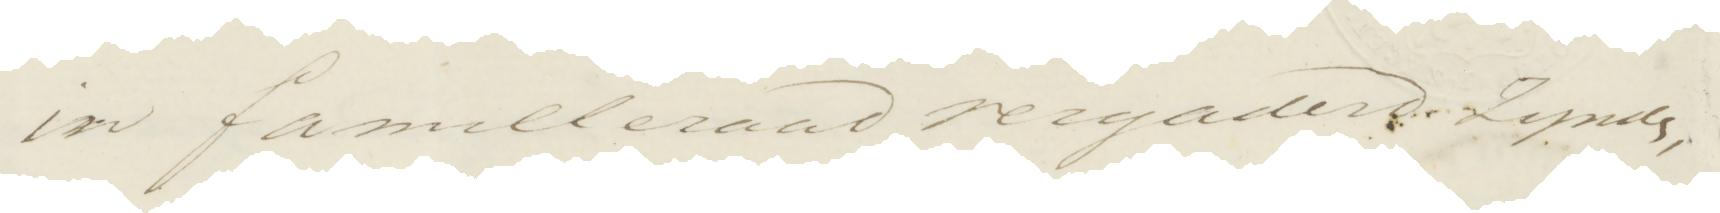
in familleraad vergaderd zynde
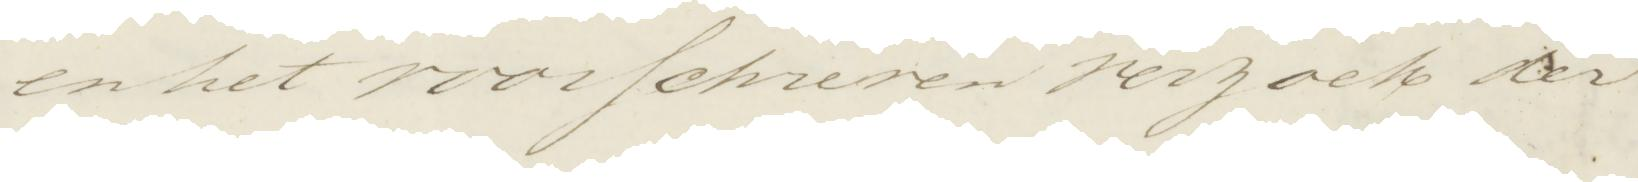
en het voorschreven verzoek der
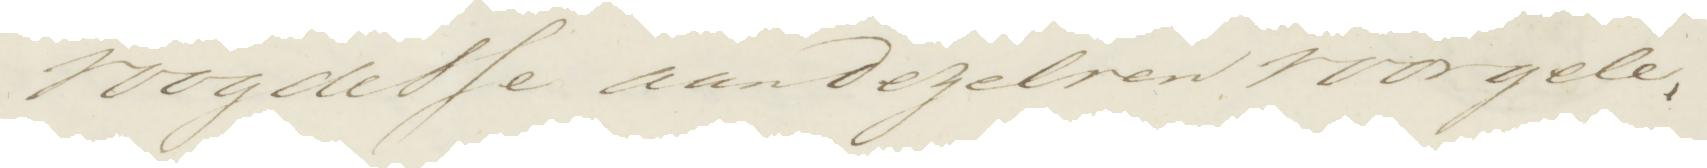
voogdesse aan dezelven voorgele„
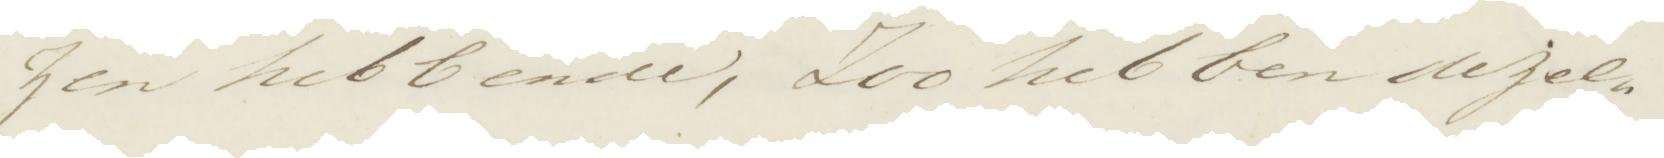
zen hebbende, zoo hebben dezel
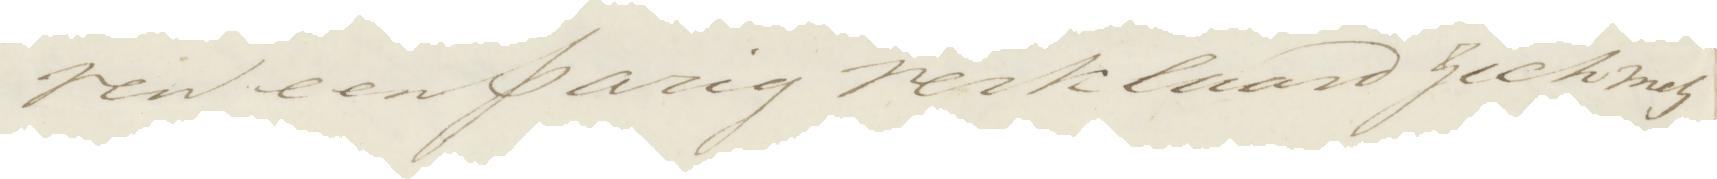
ven eenparig verklaard zich met
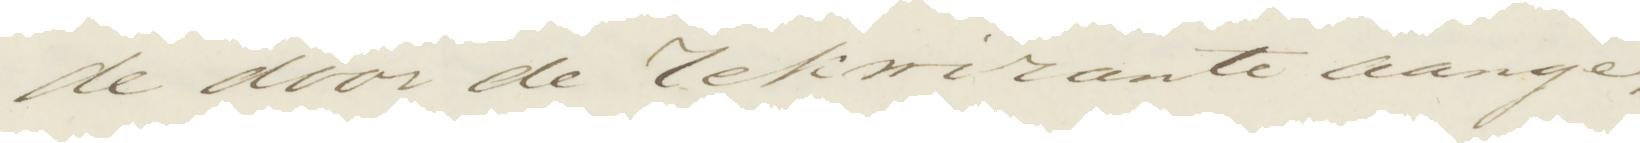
de door de rekwirante aange
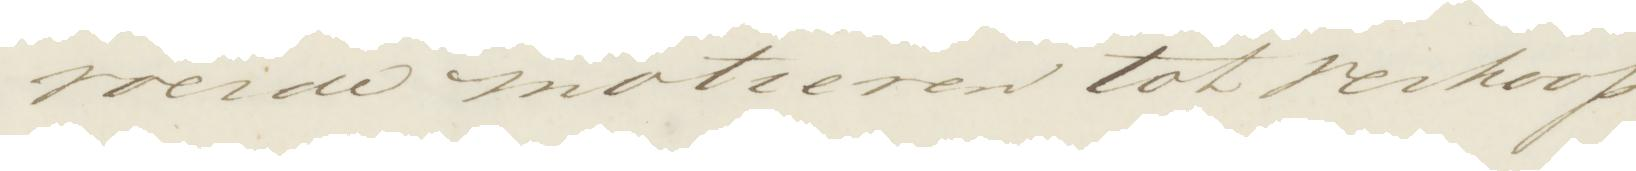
voerde motieven tot verkoop
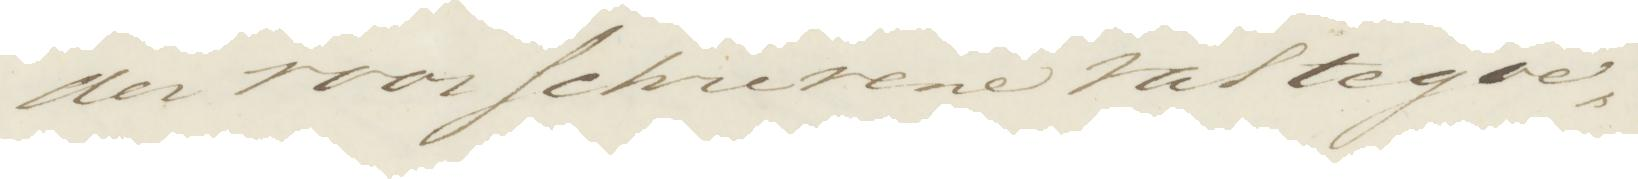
der voorschrevene vaste goe„
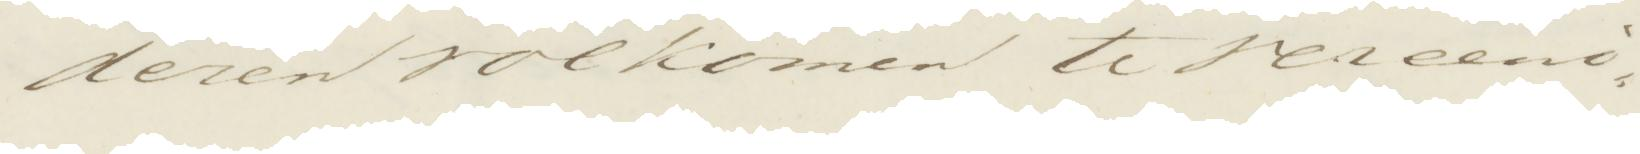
deren volkomen te vereene„
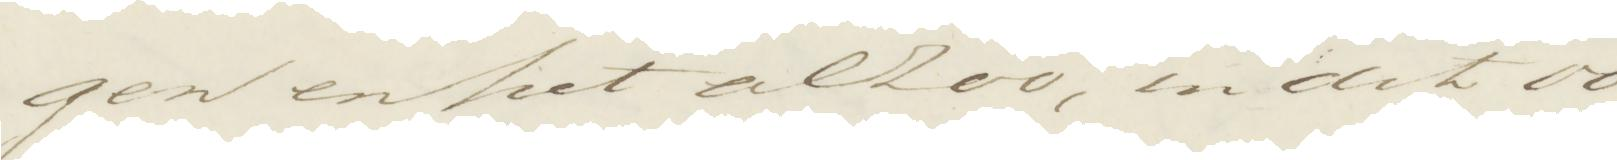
gen en het alzoo, in dit oo
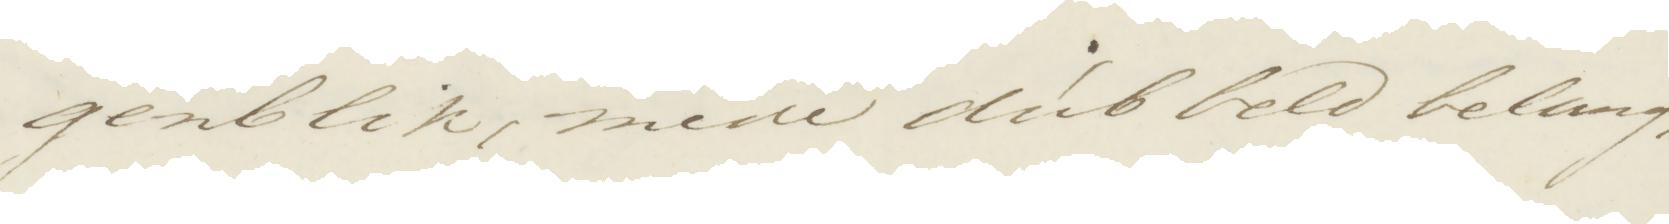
genblik, mede dubbeld belang
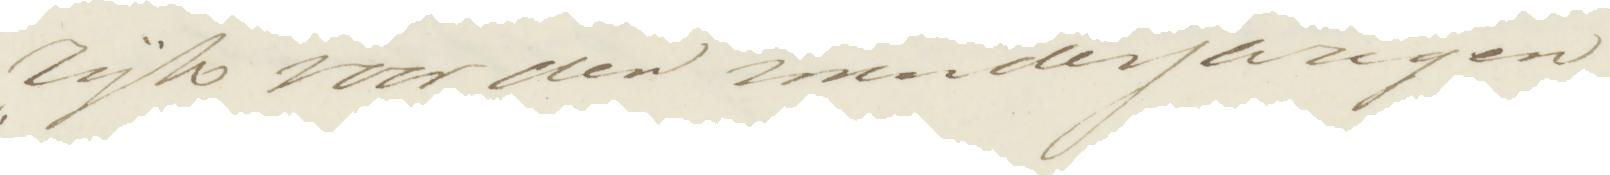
rijk voor den minderjarigen
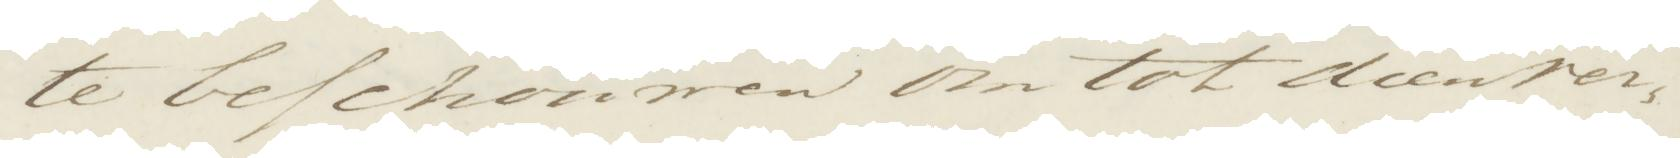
te beschouwen om tot dien ver„
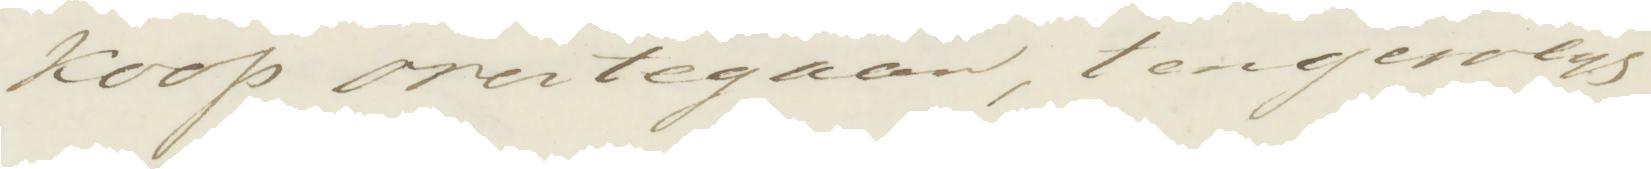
koop over tegaan, ten gevolge
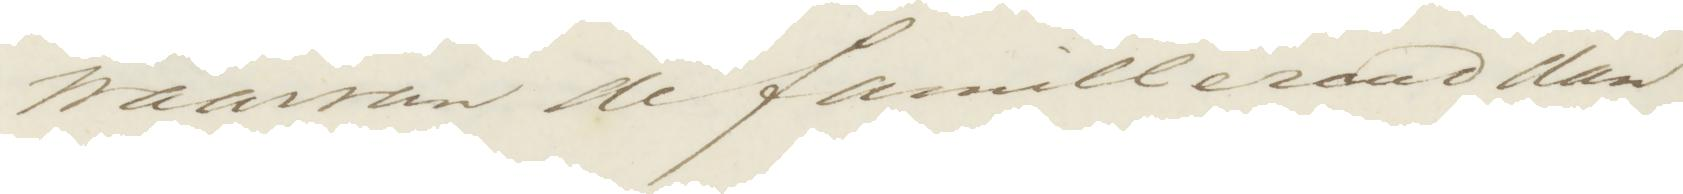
waarvan de familleraad dan
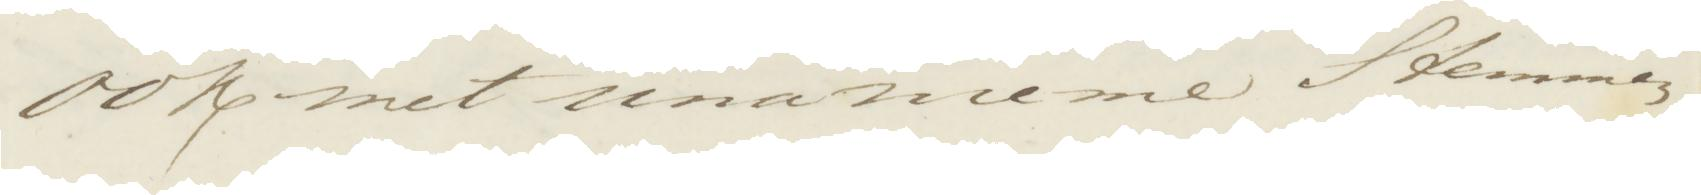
ook met unanieme stemmen
